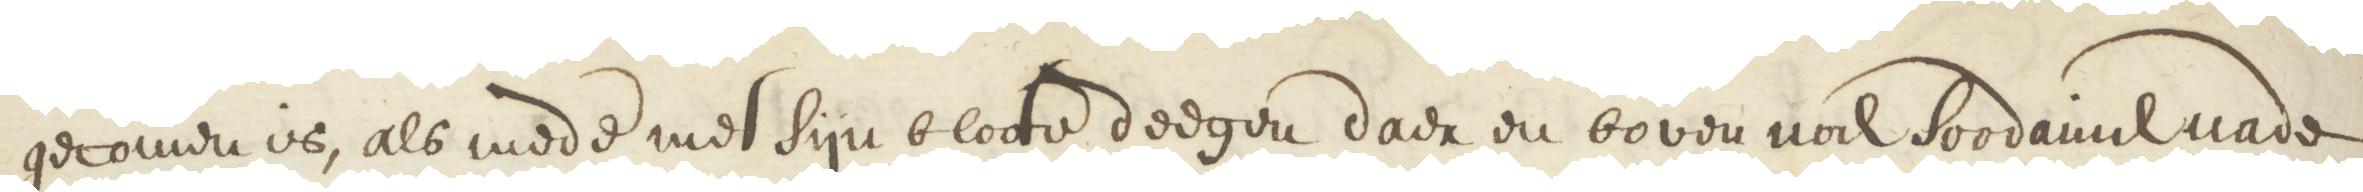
gecomen is, als mede met sijn bloote deegen daer en boven noch soodanich na de
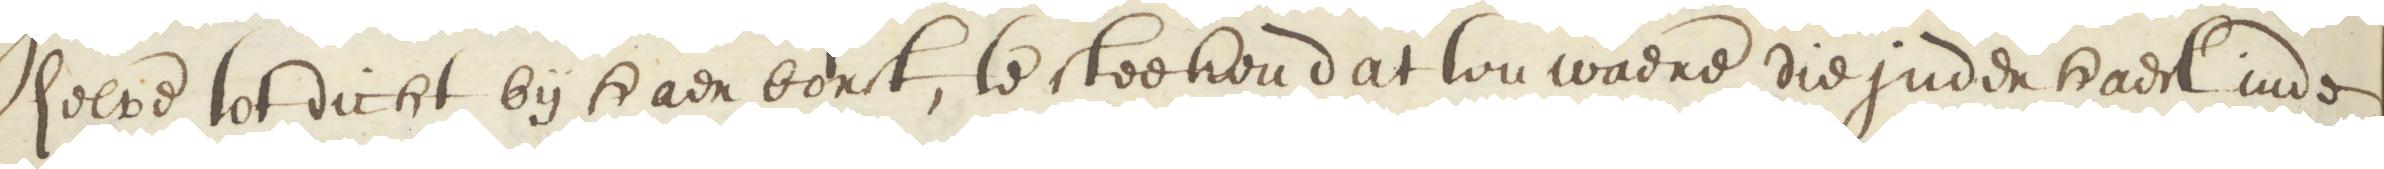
selve tot dicht bij haer borst, te steeken, dat ten waere die jnder haest inde
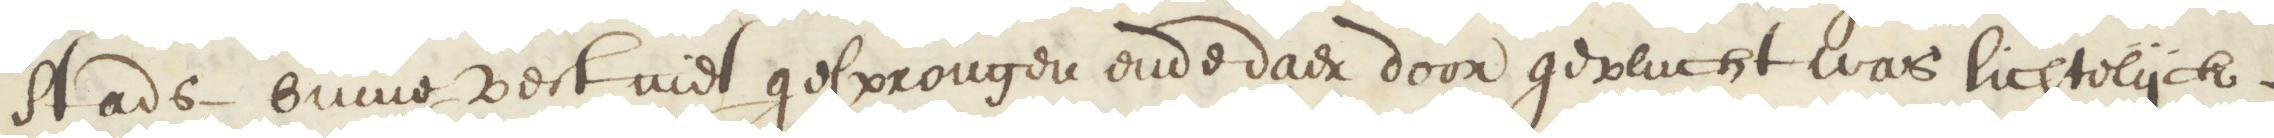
stads- binne vest niet gesprongen ende daer door gevlucht was lichtelijck
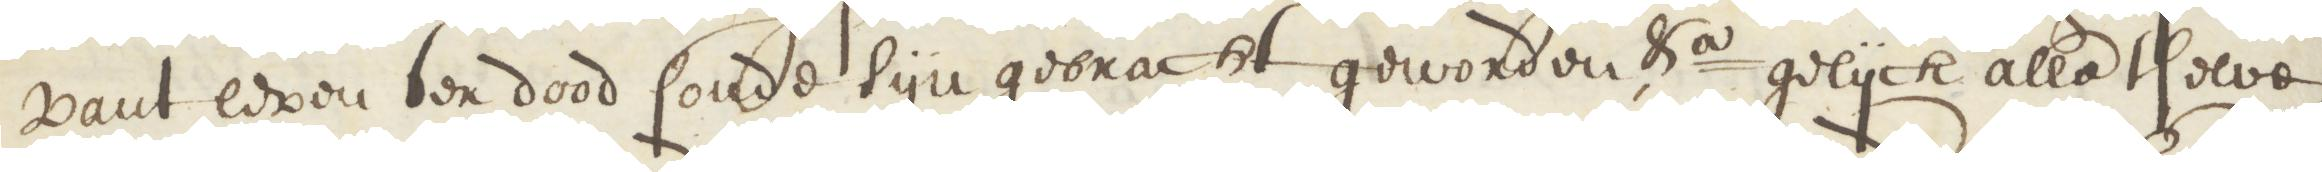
vant leven ter dood soude sijn gebracht geworden, &=a gelijck alle tselve
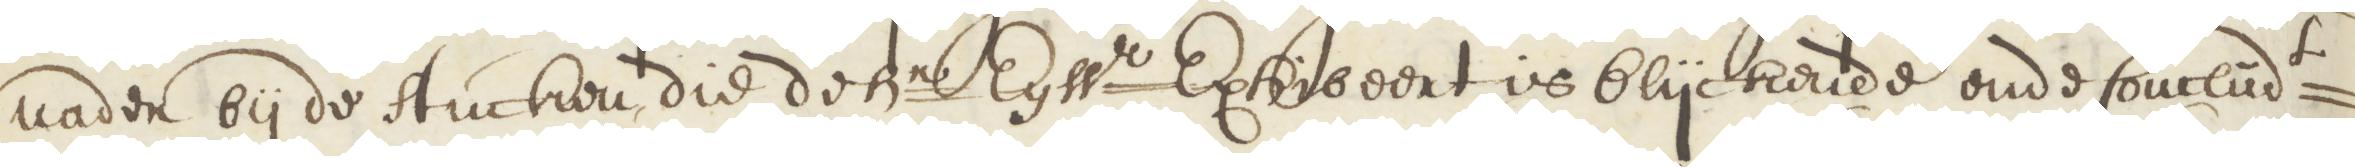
nader bij de stucken die de h=r Eyss=r Exhibeert is blijckende ende Conclud=t
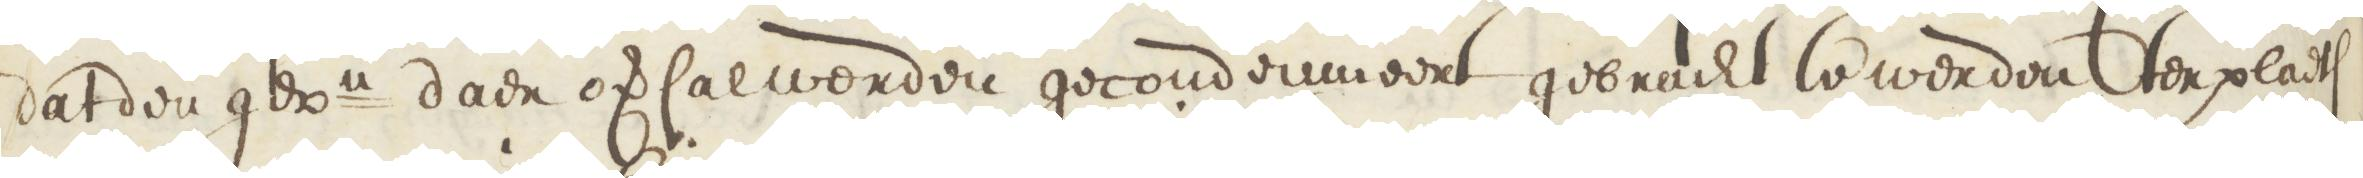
dat den gev=n daer over sal worden gecondemneert gebracht te werden ter plaets
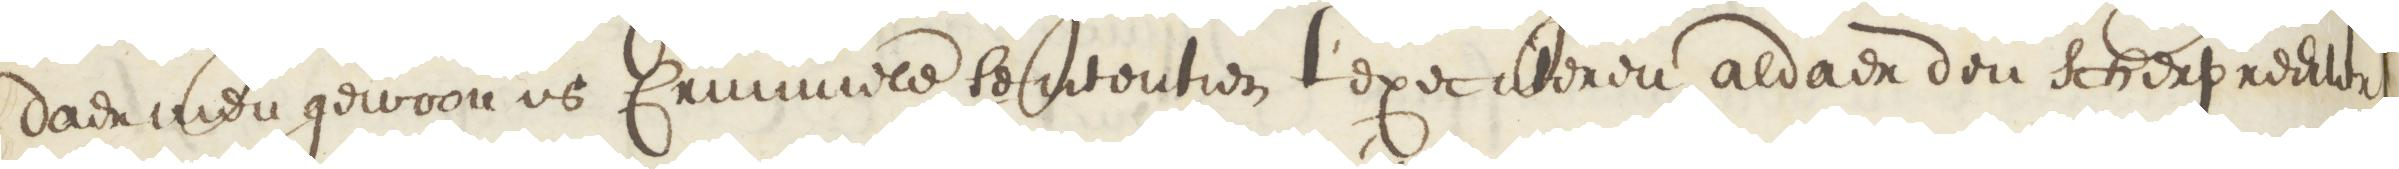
daer men gewoon is Criminele sententien t' executeren, aldaer den scherprechter
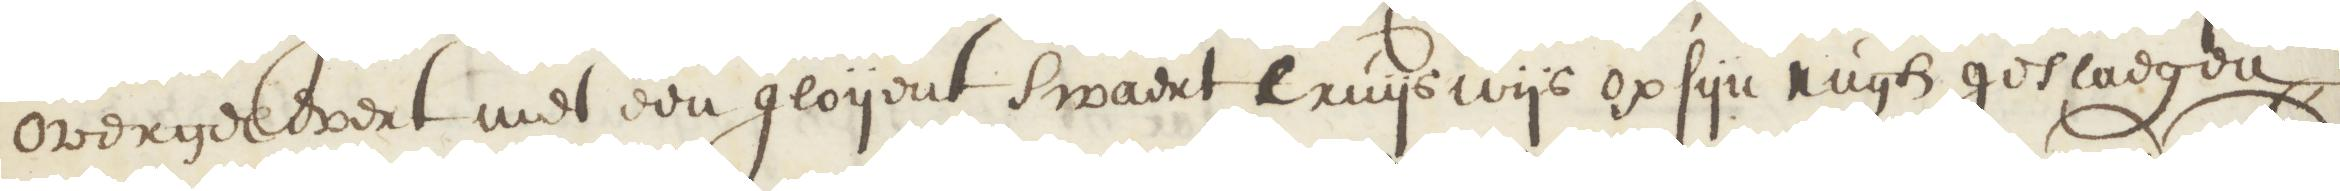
overgelevert met een gloijent swaert Cruijs wijs op sijn rugh geslaegen,
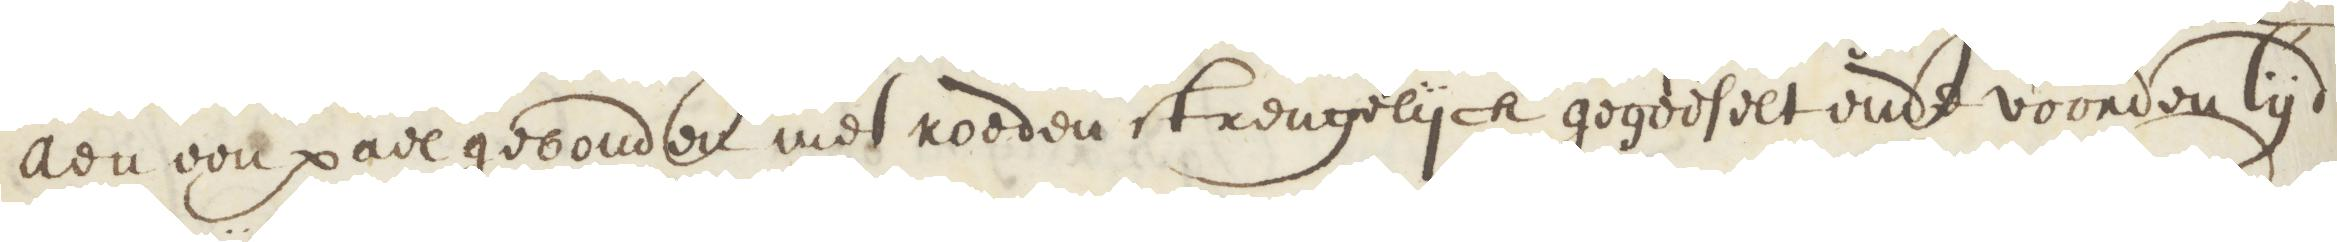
aen een pael gebonden met roeden strengelijck gegeeselt ende voorden tijd
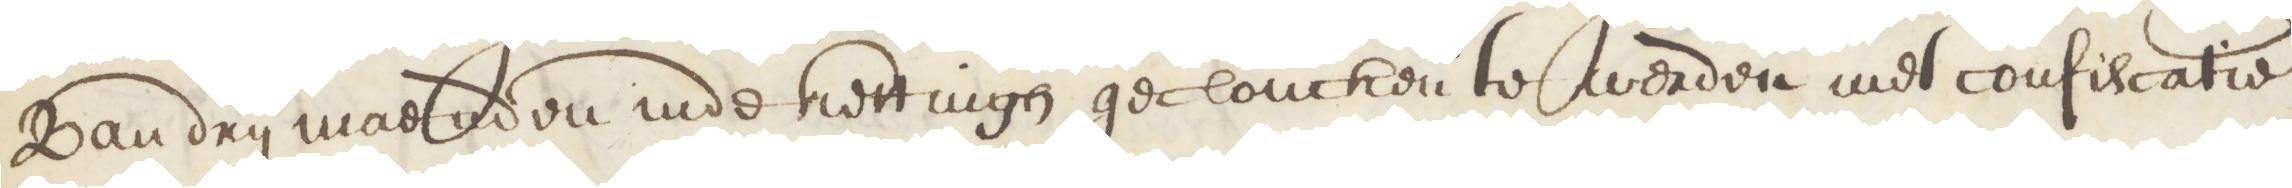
van drij maenden inde kettingh gecloncken te werden met confiscatie
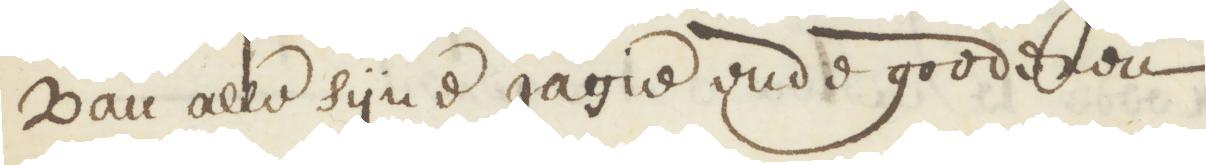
van alle sijne gagie ende goederen
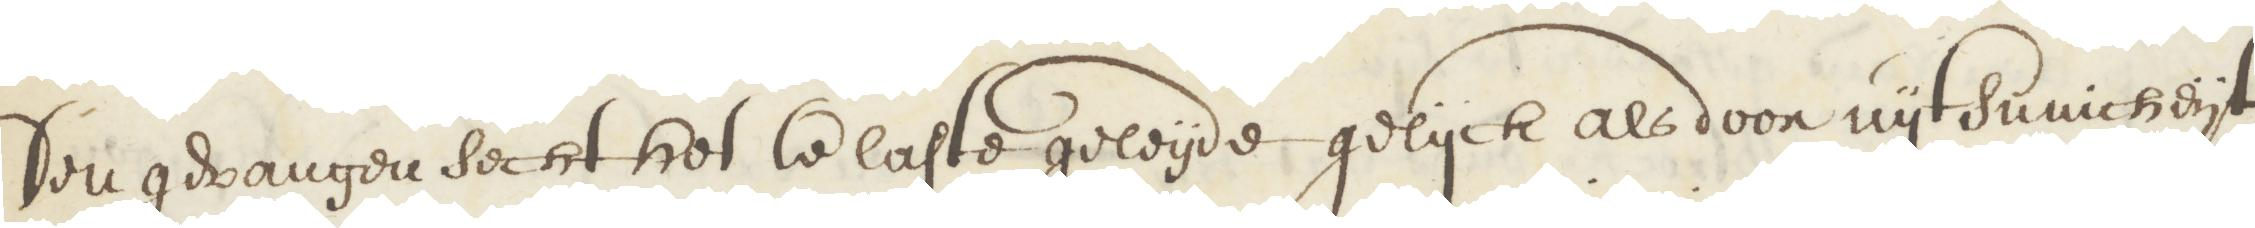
Den gevangen secht het te laste geleijde gelijck als door uijt sunicheijt
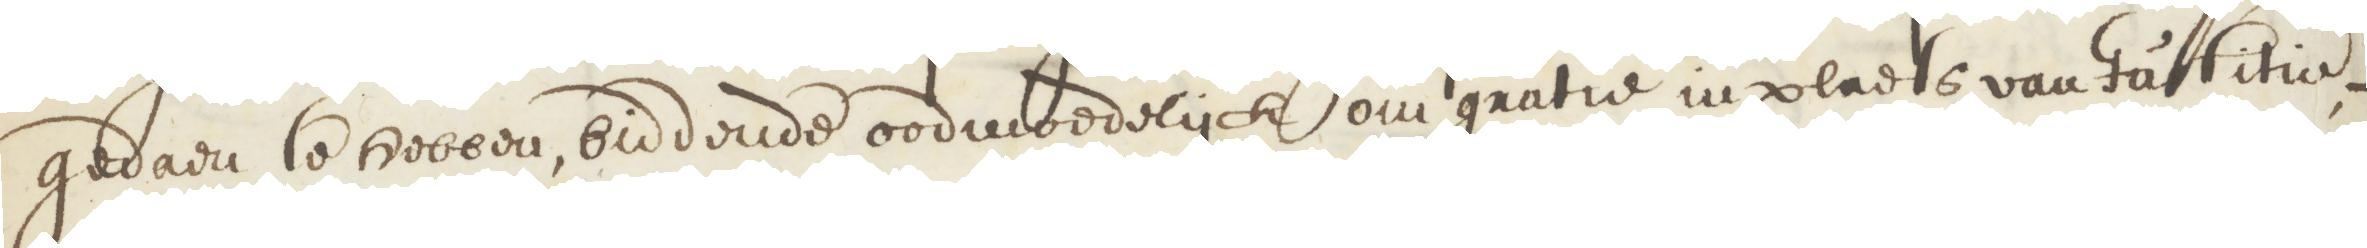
gedaen te hebben, biddende oodmoedelijck om gratie in plaets van Iustitie, —
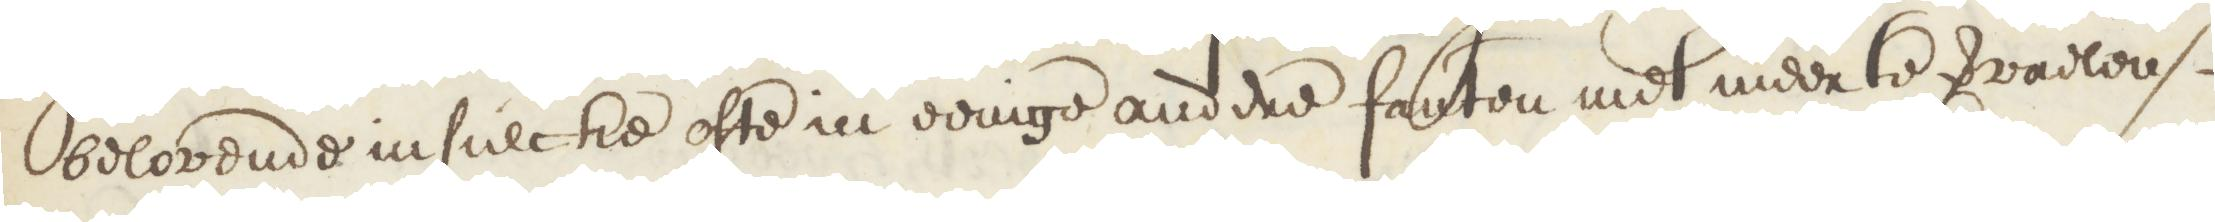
belovende insulcke ofte in eenige andere fauten niet meer te vervaelen/
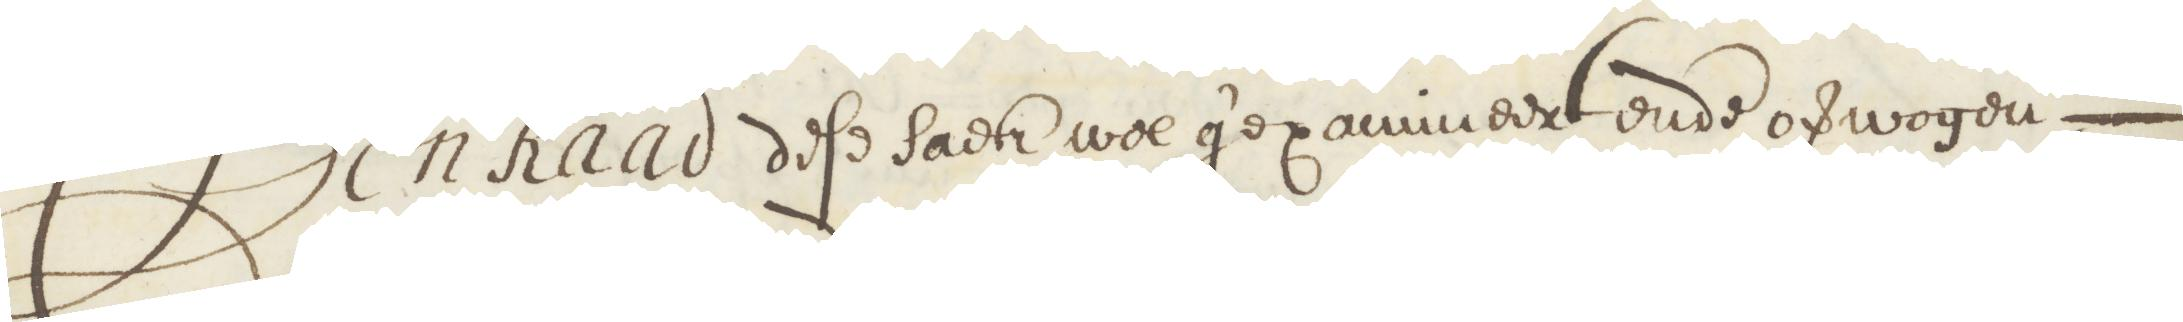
Den Raad dese saek wel g'examineert ende overwogen —
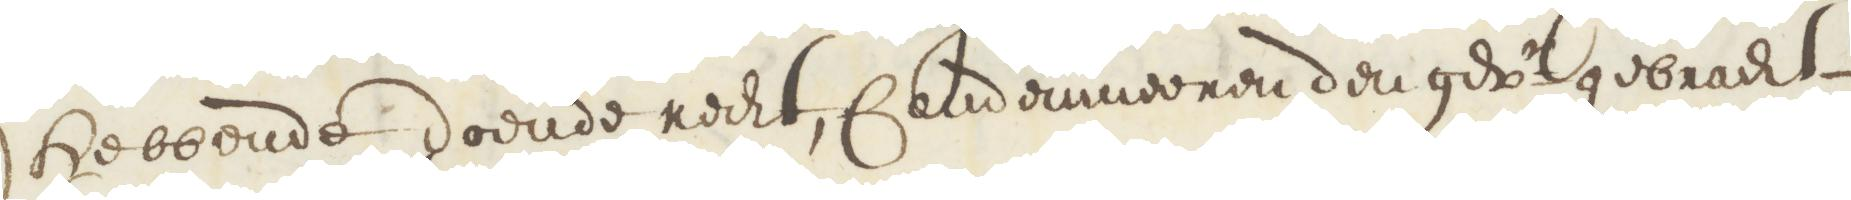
hebbende doende recht, Condemneeren den gev=e gebracht
